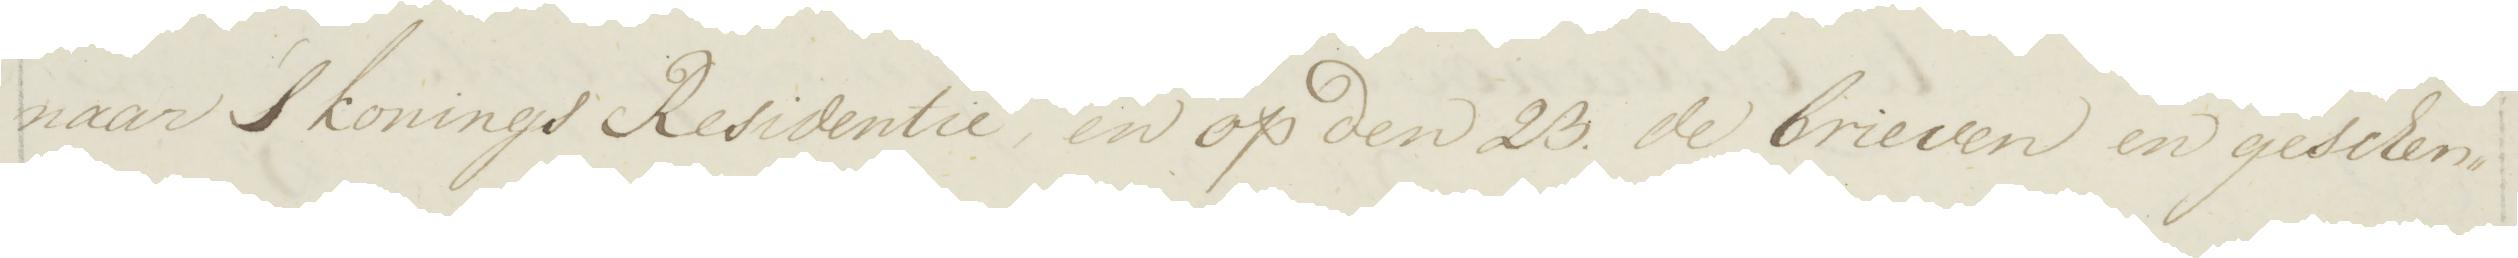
naar 's konings Residentie, en op den 23. de brieven en geschen„
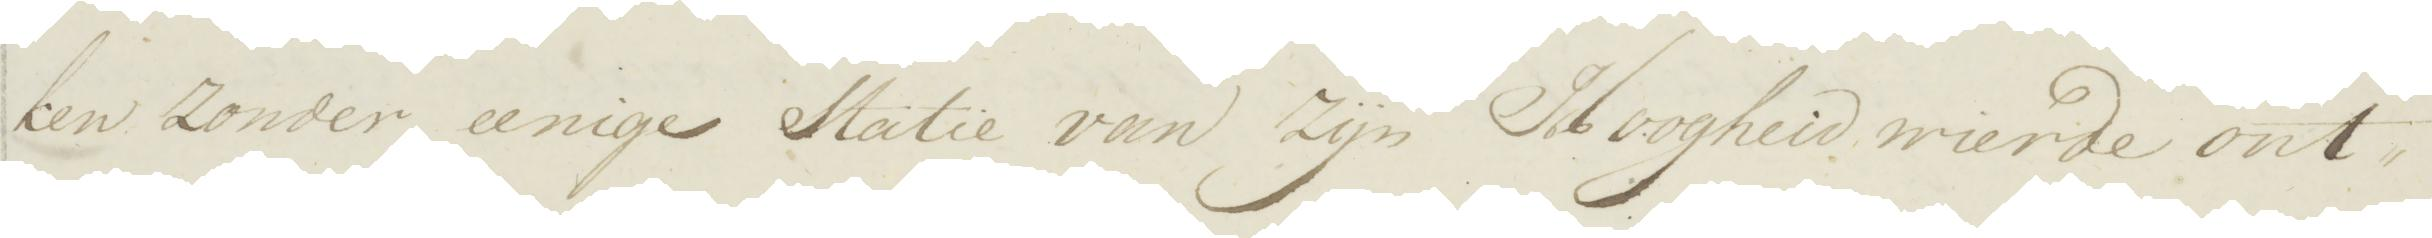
ken zonder eenige statie van zijn Hoogheid wierde ont„
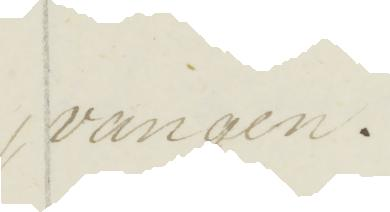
„vangen.
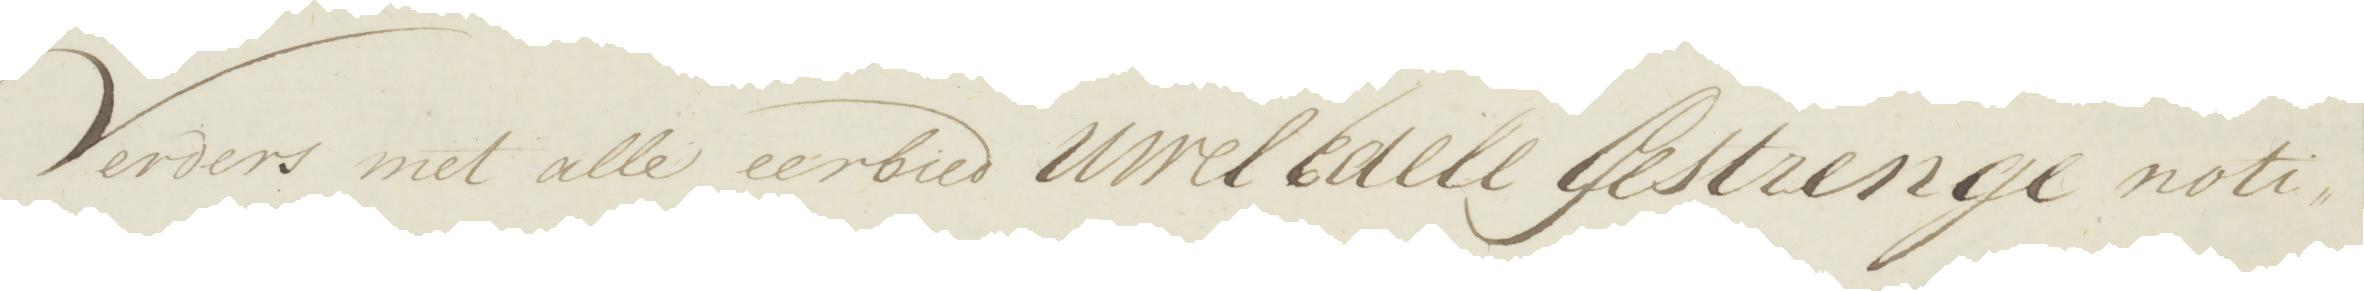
Verders met alle eerbied uwel edele Gestrenge noti„
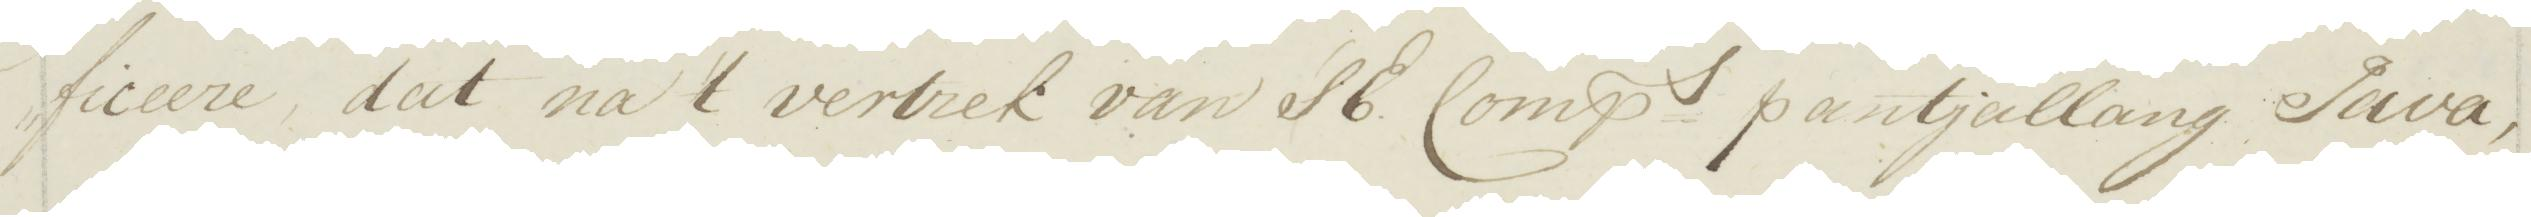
„ficeere, dat na ’t vertrek van ’sE. Comp=s pantjallang Java„
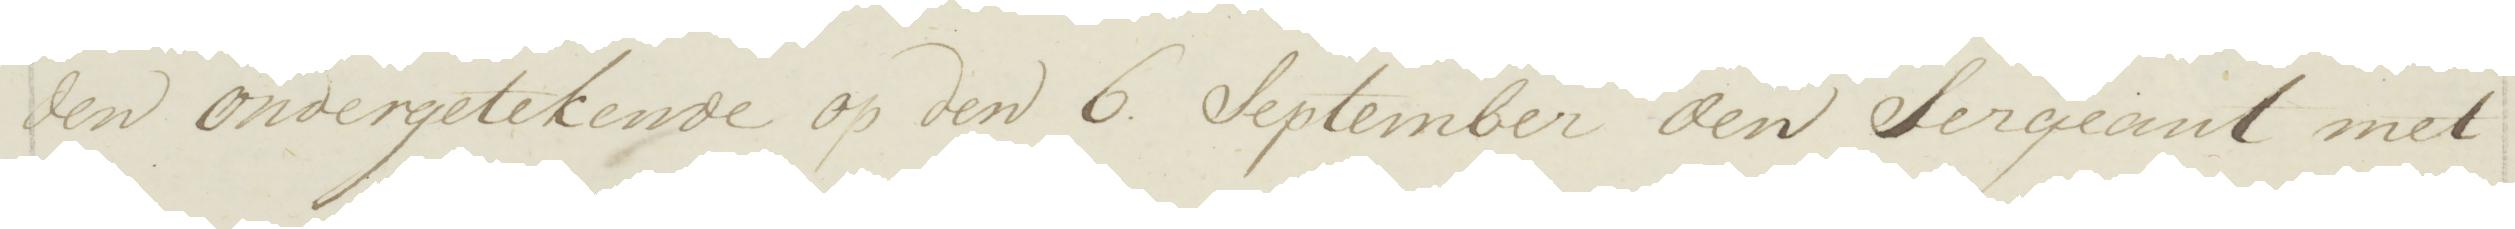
den ondergetekende op den 6. september den sergeant met
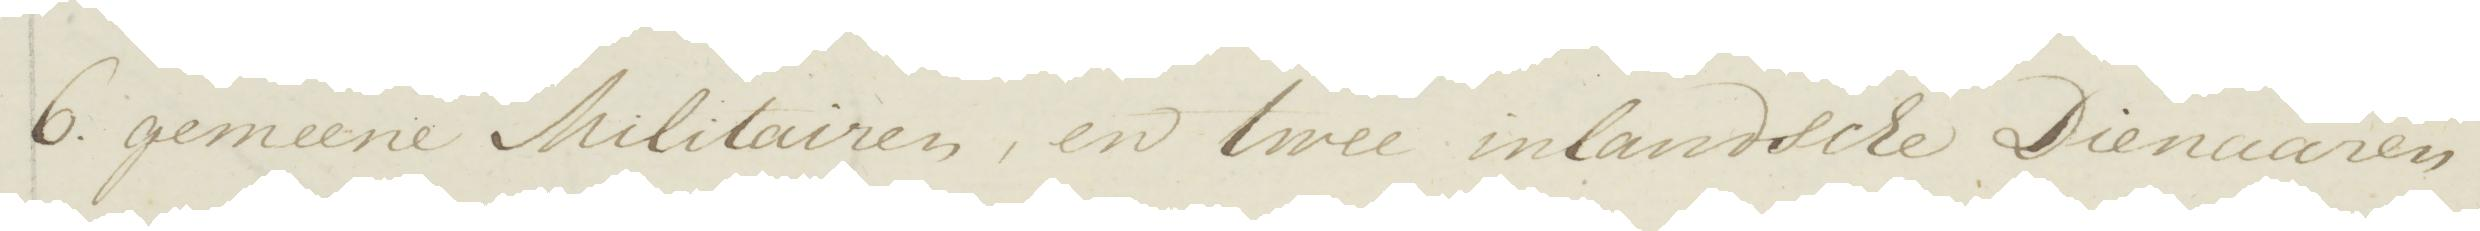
6. gemeene Militairen, en twee inlandsche Dienaaren
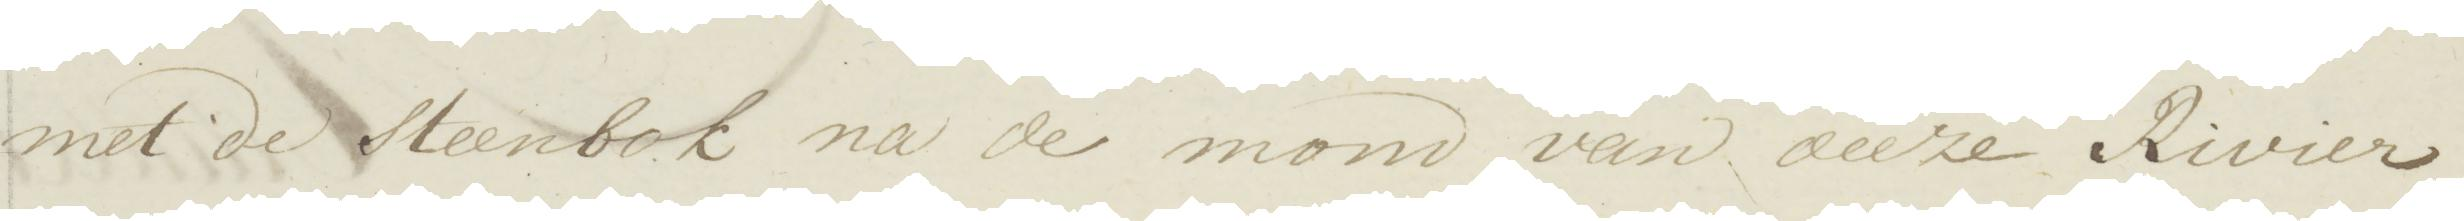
met de steenbok na de mond van deeze Rivier
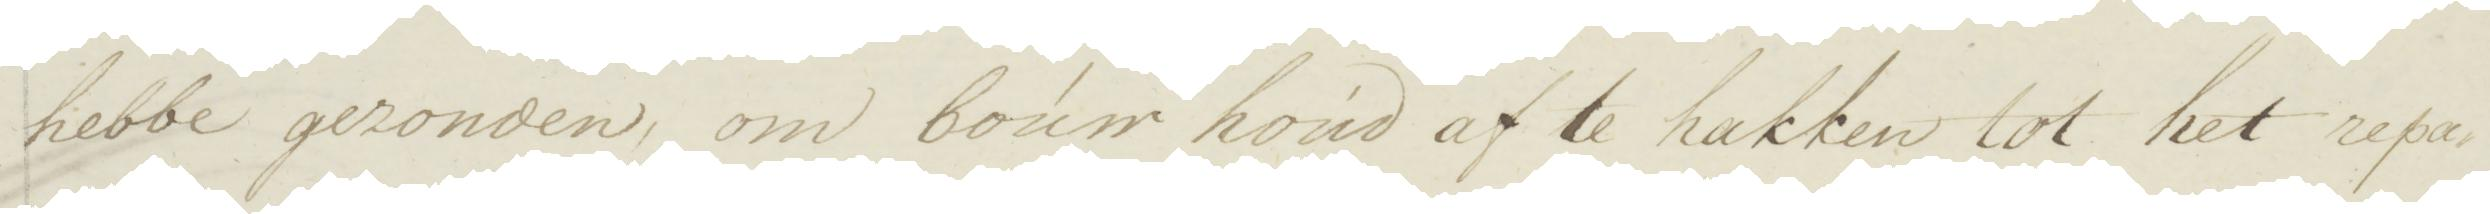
hebbe gezonden, om bouw houd af te hakken tot het repa„
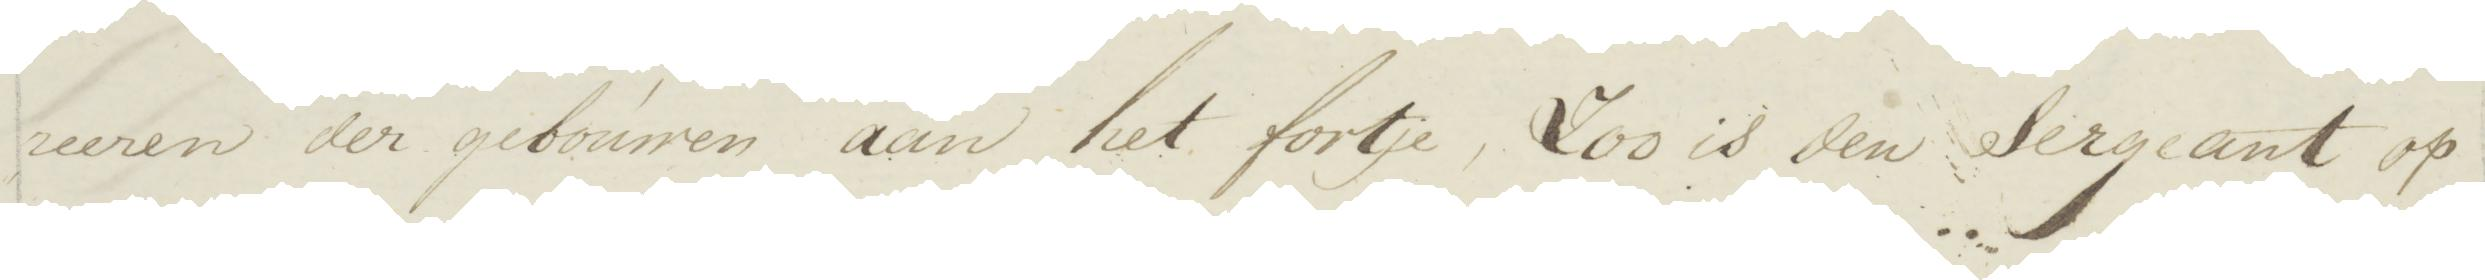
„reeren der gebouwen aan het fortje, Zoo is den sergeant op
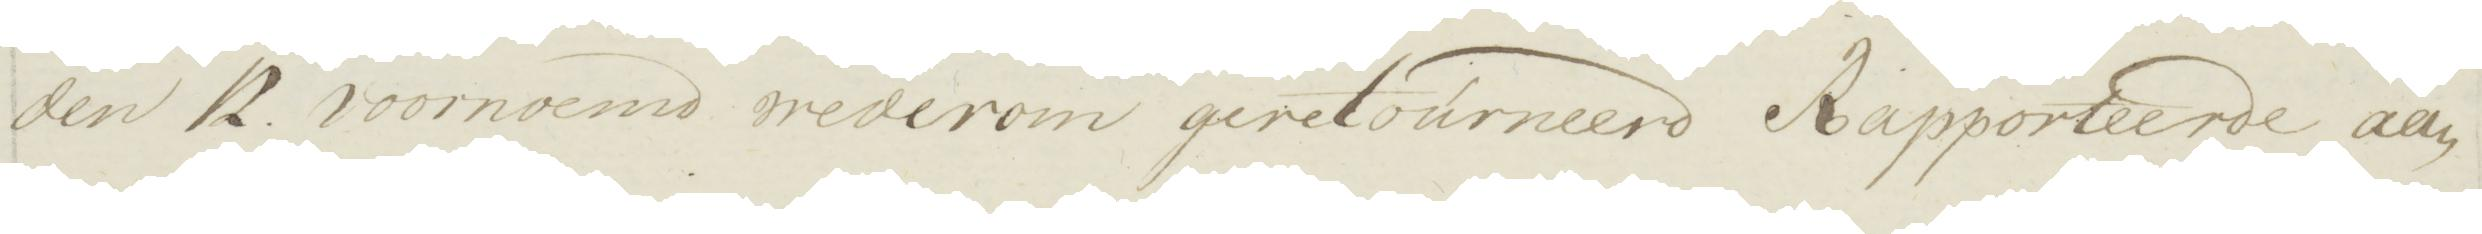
den 12. voornoemd wederom geretourneerd Rapporteerde aan
